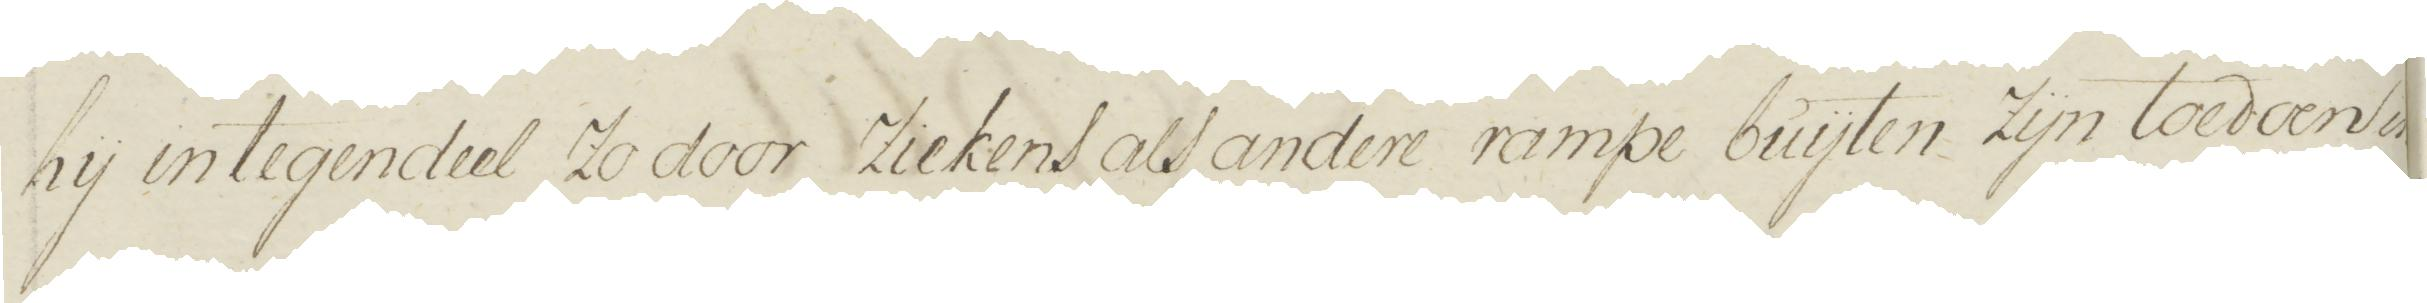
hij integendeel zo door ziekens als andere rampe buijten zijn toedoen i
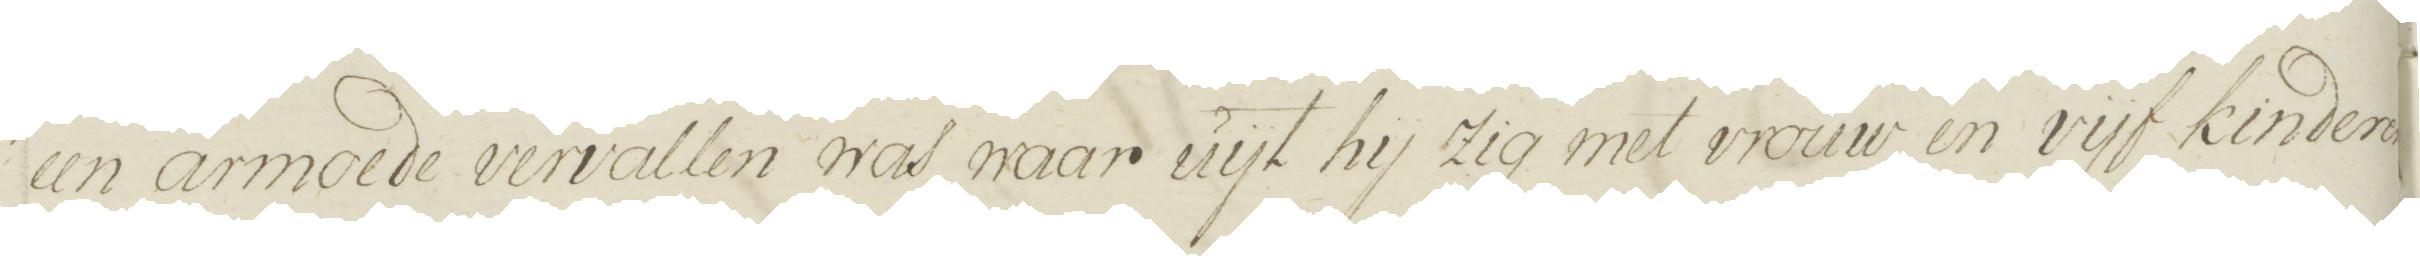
een armoede vervallen was waar uijt hij zig met vrouw en vijf kinder
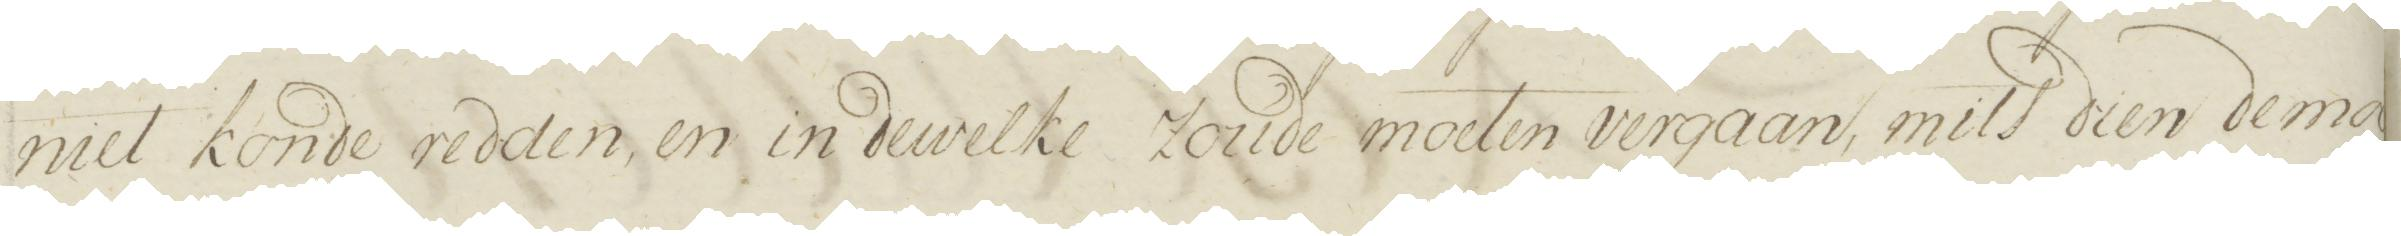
niet konde redden, en in dewelke zoude moeten vergaan, mits dien demo
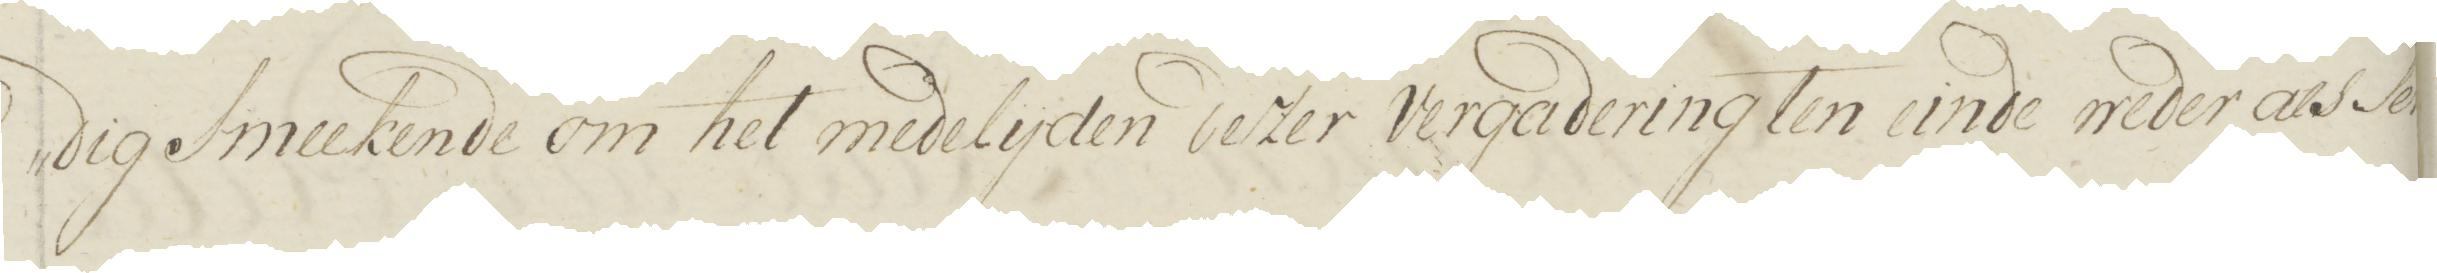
„dig smeekende om het medelijden dezer vergadering ten einde weder als se
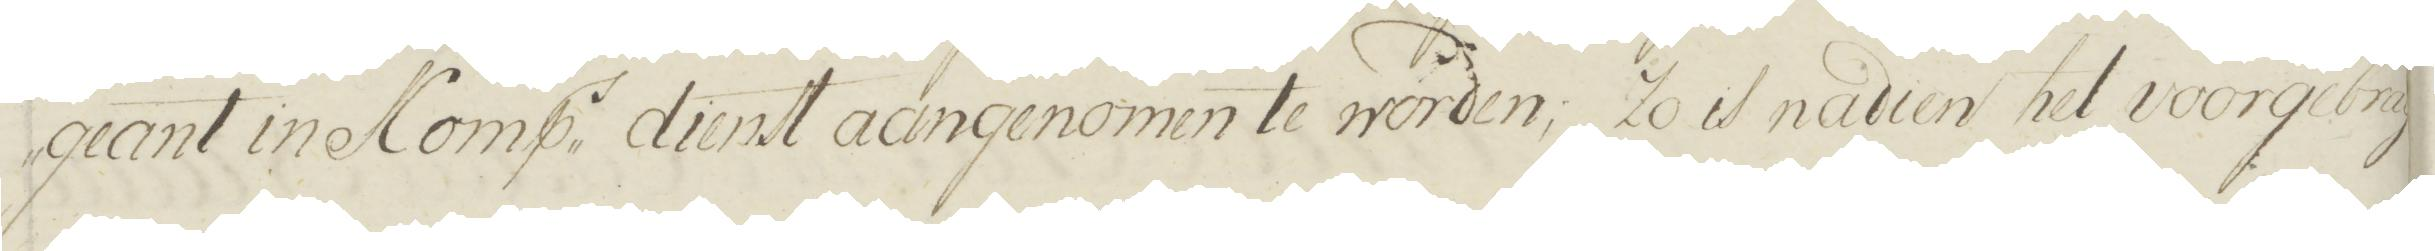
„geant in sComp„s dienst aangenomen te worden; zo is nadien het voorgebrag
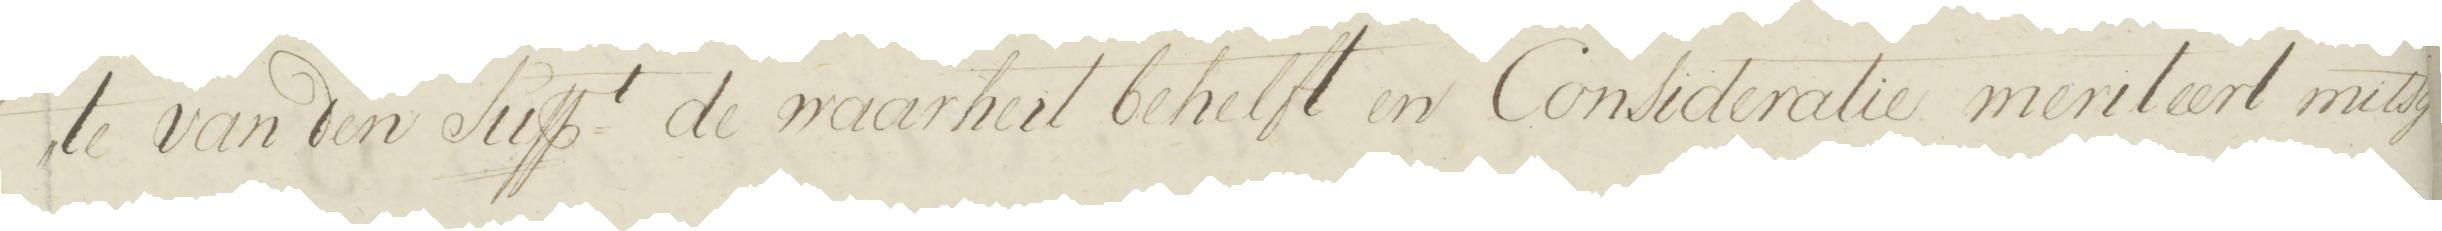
„te van den Supp=t de waarheit behelft en Consideratie meriteert mitsg
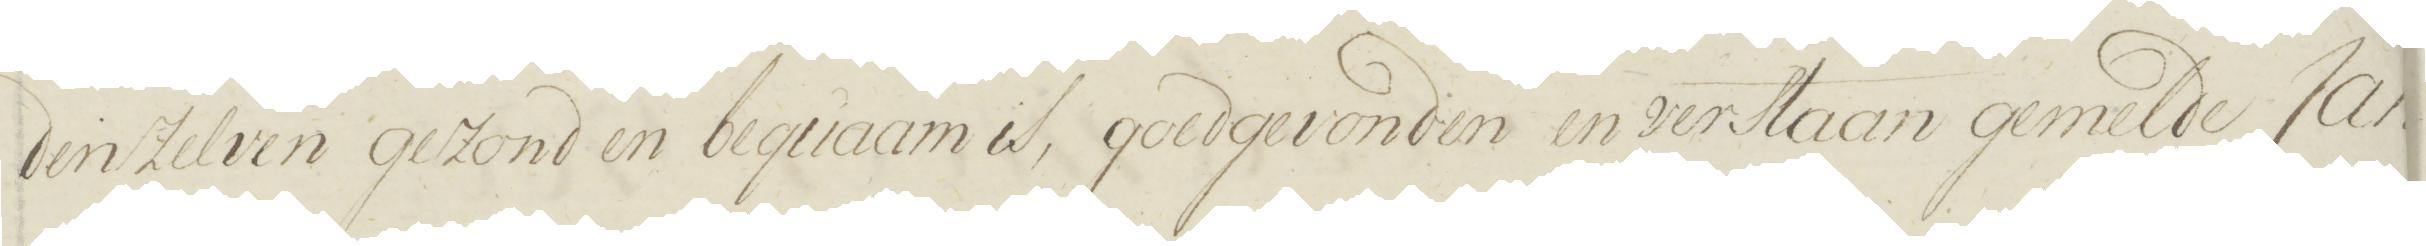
denzelven gezond en bequaam is, goedgevonden en verstaan gemelde Jan
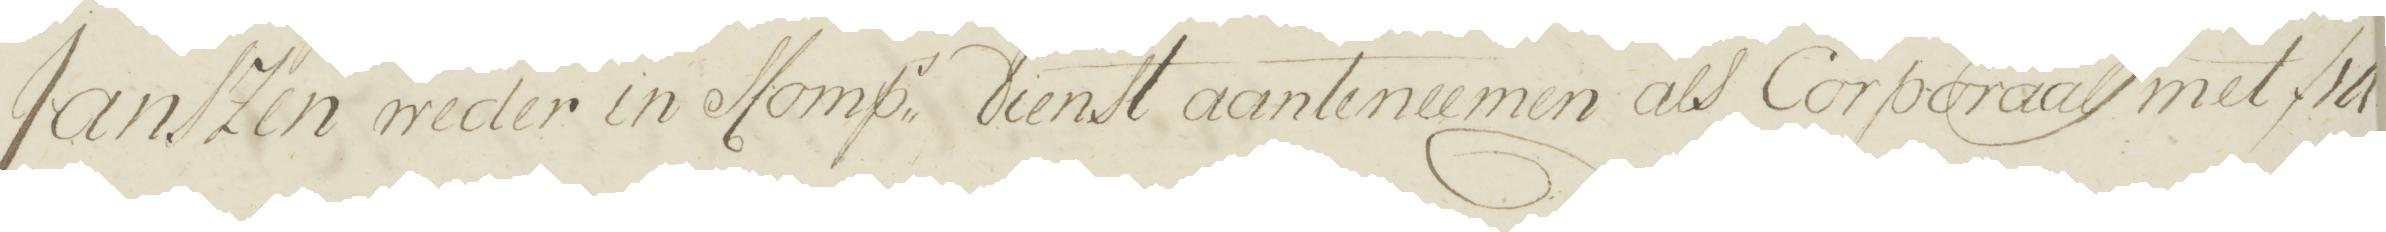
Janszen weder in sComp„s dienst aanteneemen als Corporaal met ƒ14
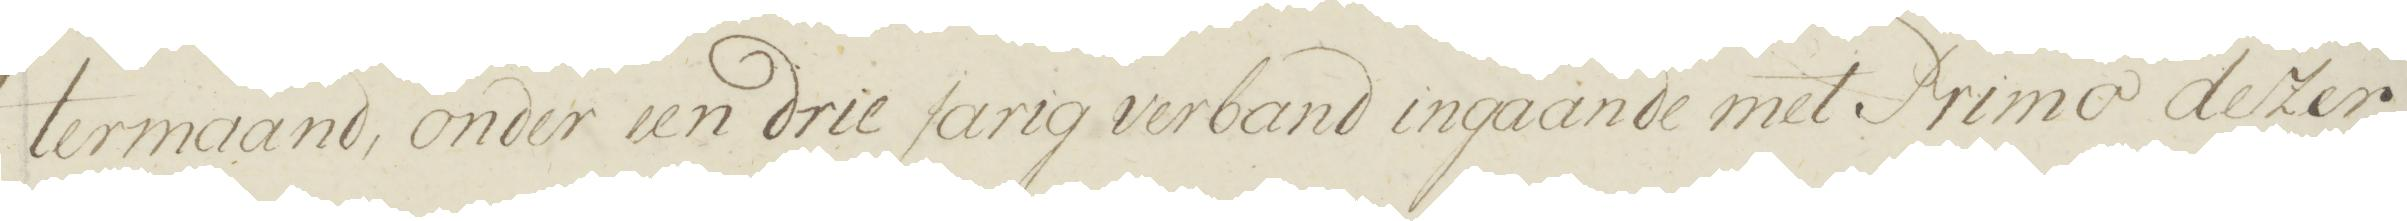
termaand, onder een drie jarig verband ingaande met Primo dezer
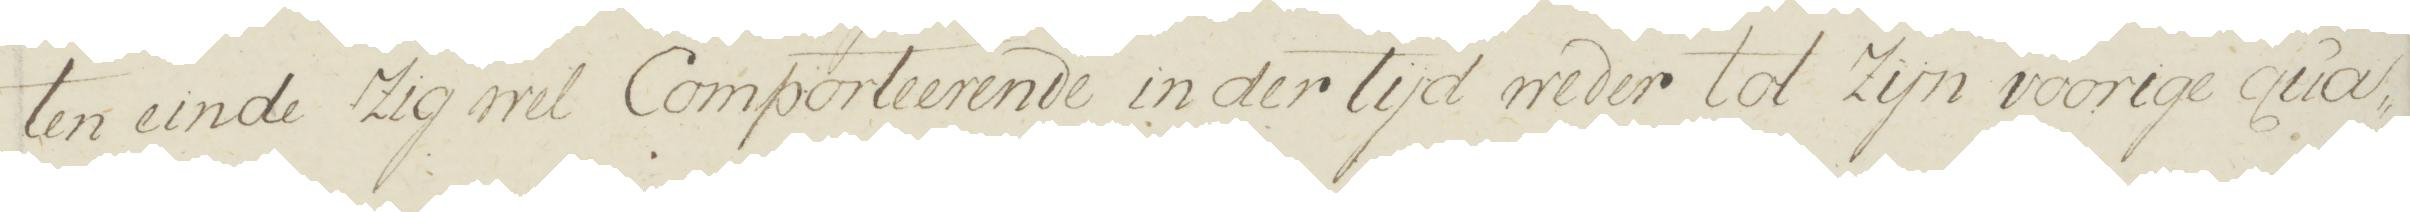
ten einde zig wel Comporteerende in der tijd weder tot zijn voorige qua„
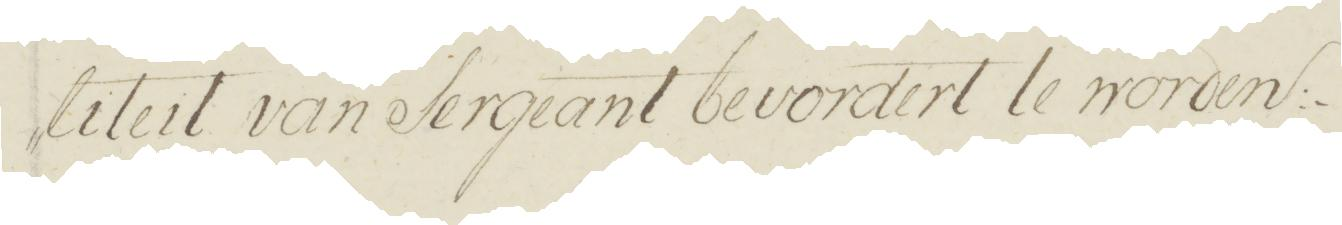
„liteit van Sergeant bevordert te worden:.
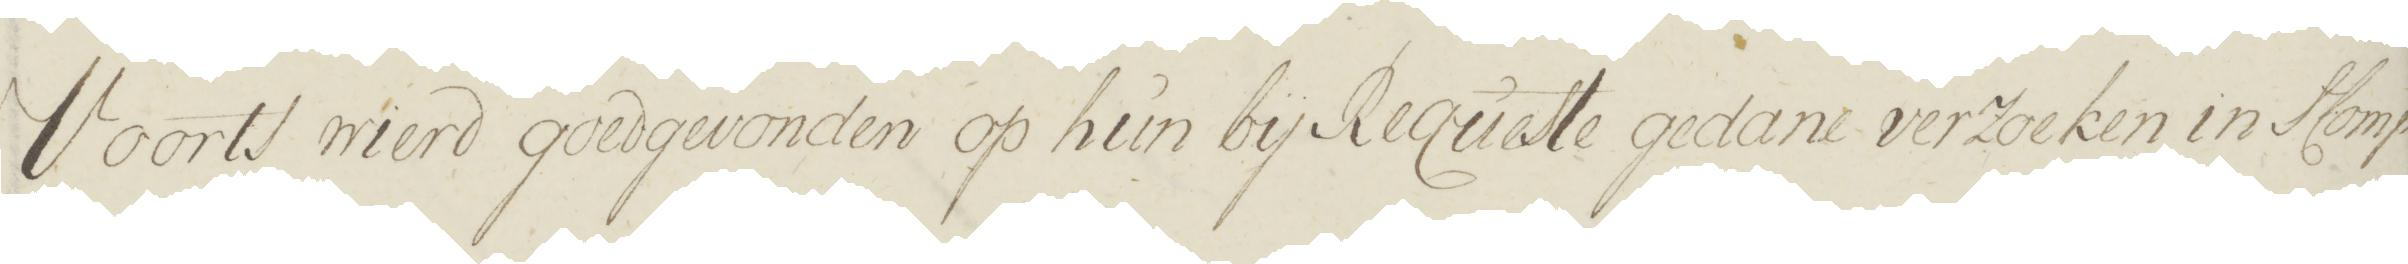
Voorts wierd goedgevonden op hun bij Requeste gedane verzoeken in sComp
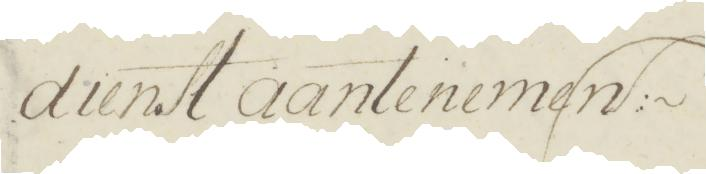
dienst aantenemen:-
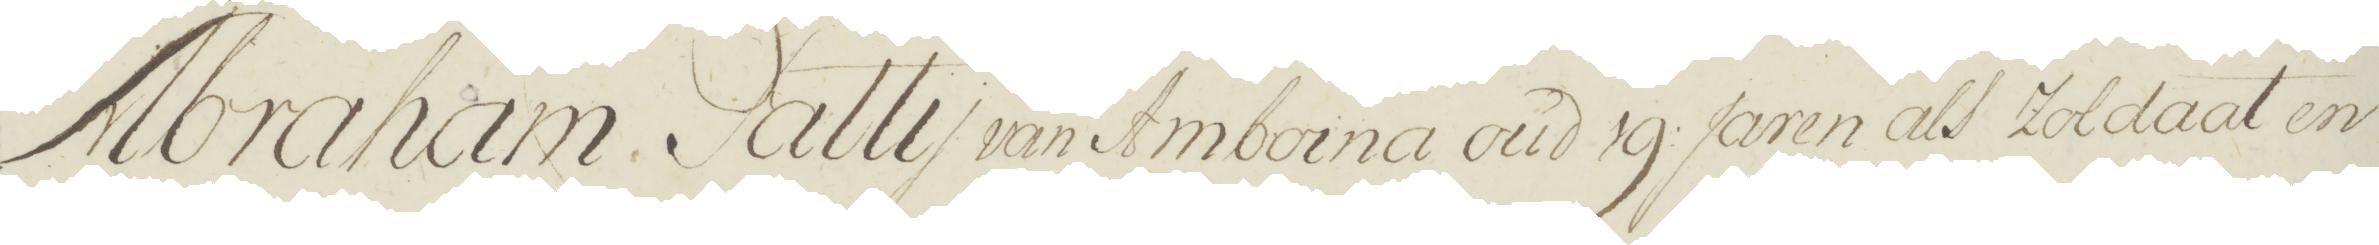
Abraham Pattij van Amboina oud 19: Jaren als zoldaat en
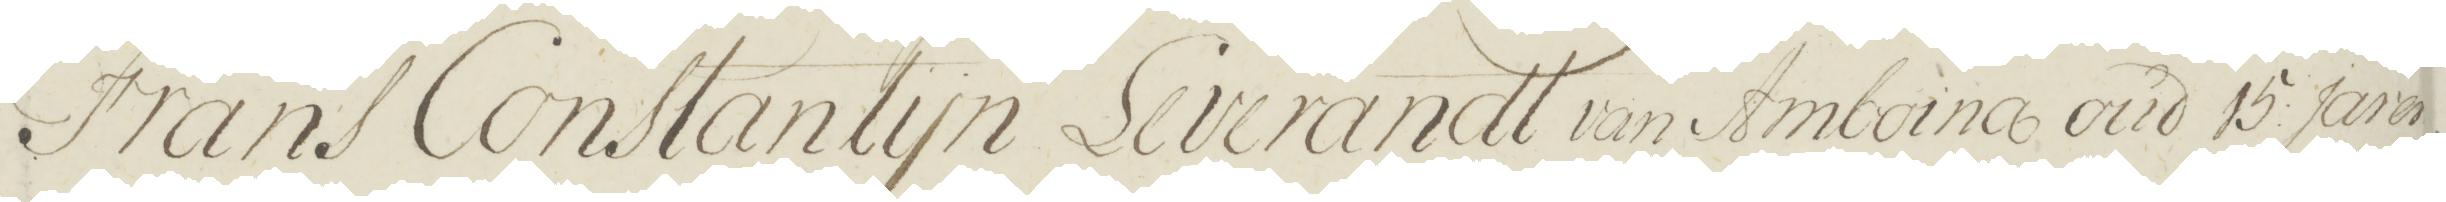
Frans Constantijn Leverandt van Amboina oud 15: Jare
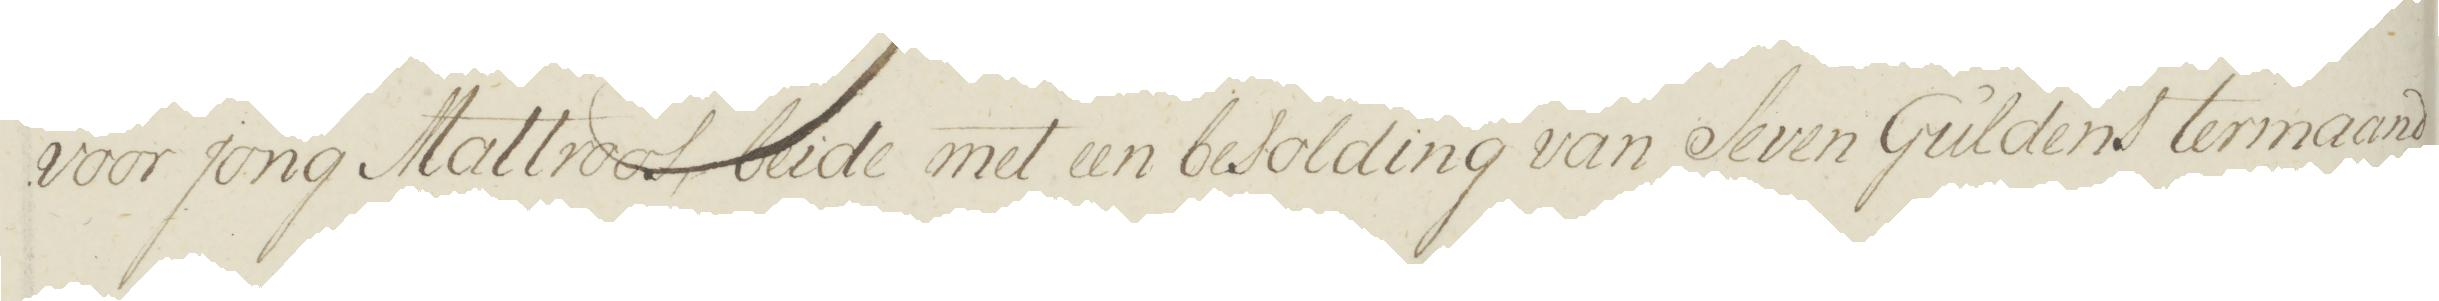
voor jong Mattroos, beide met een besolding van Seven Guldens termaand
